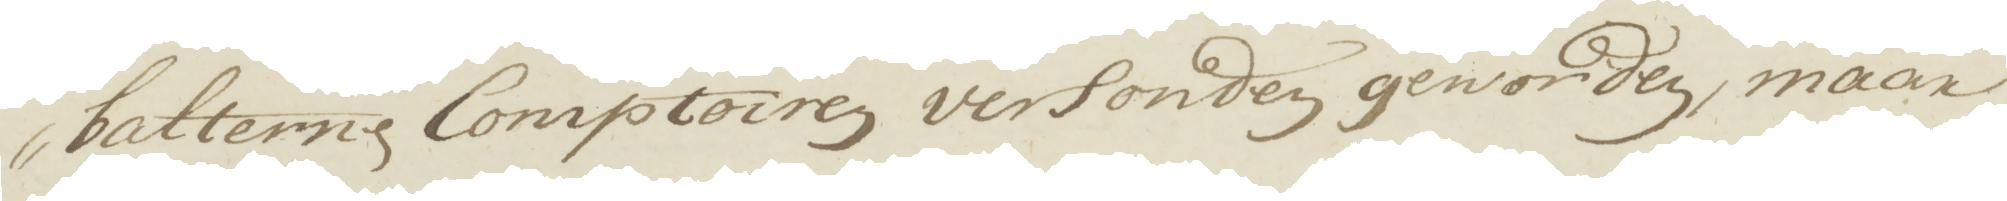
„balterne Comptoiren versonden geworden, maar
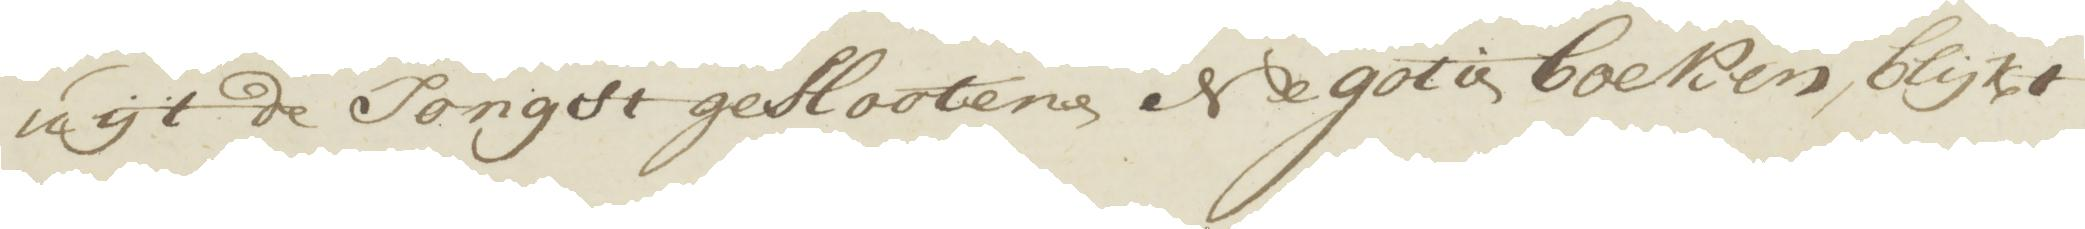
uijt de Iongst geslootene Negotie boeken, blijkt
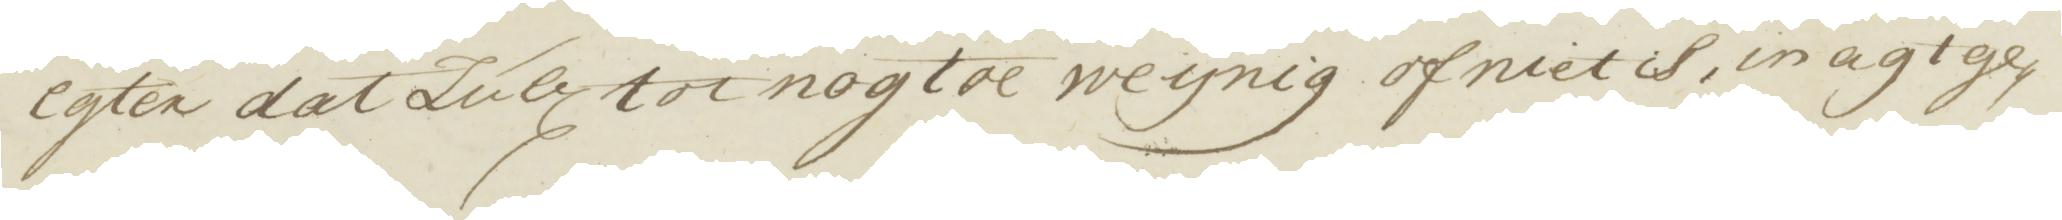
egter dat Zulx tot nog toe weijnig of niet is, in agt ge„
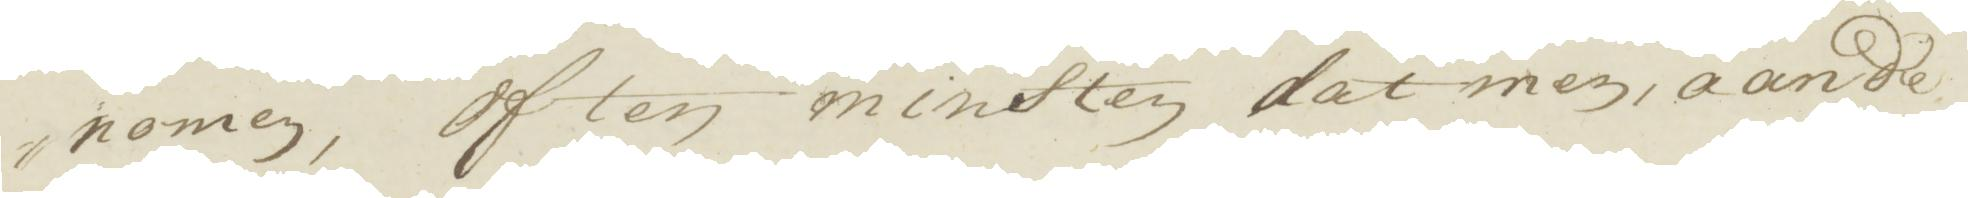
„nomen, of ten minsten dat men, aan de
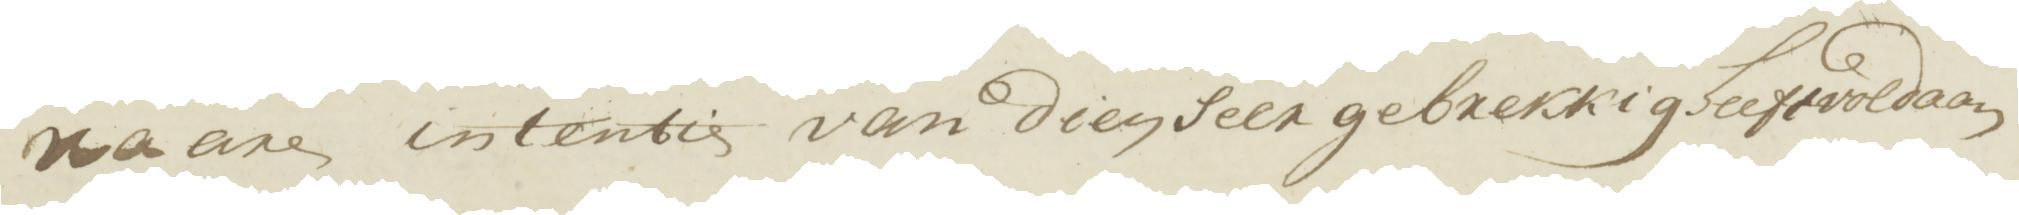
waare intentie van dien seer gebrekkig heeft voldaan
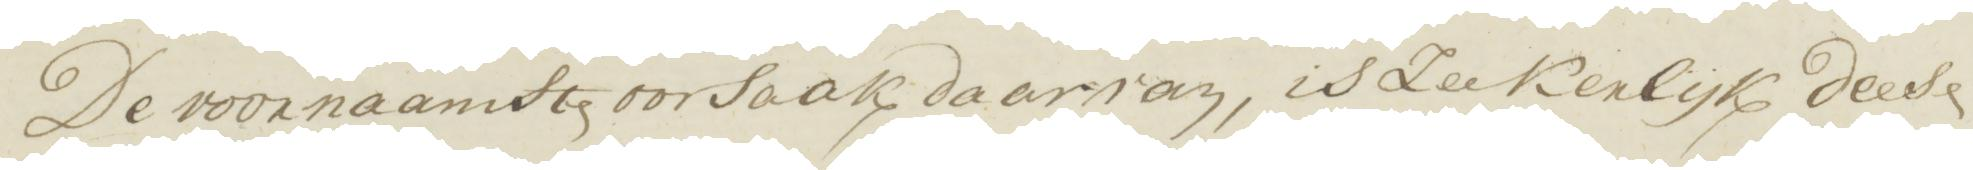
De voornaamste oorsaak daar van, is Zeekerlijk deese
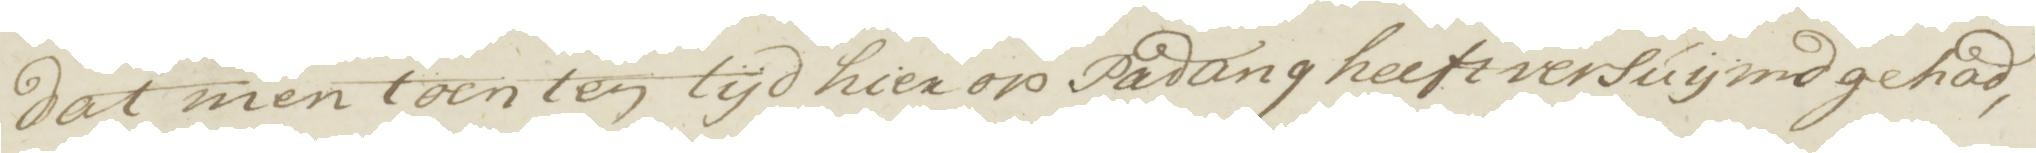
dat men toen ten tijd hier op Padang heeft versuijmd gehad,
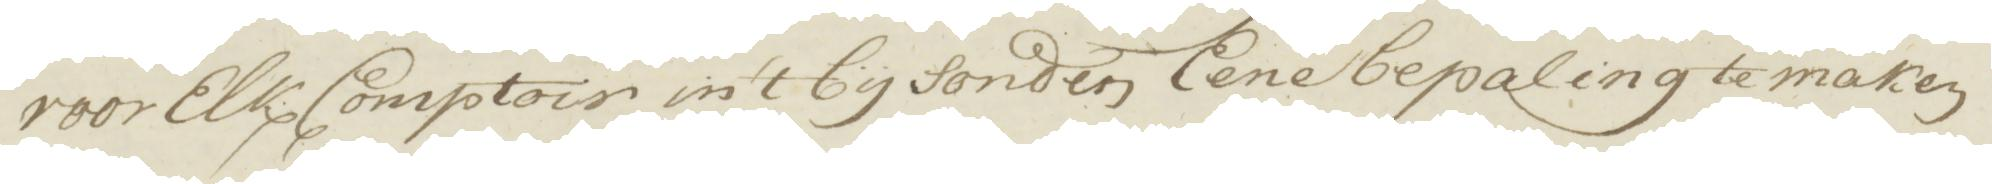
voor Elk Comptoir in ’t bij sonder Eene bepaling te maken
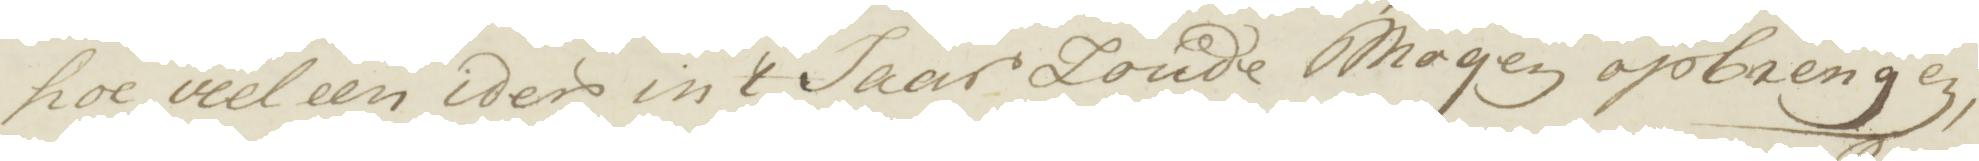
hoe veel een ider in 't Iaar Zoude mogen opbrengen,
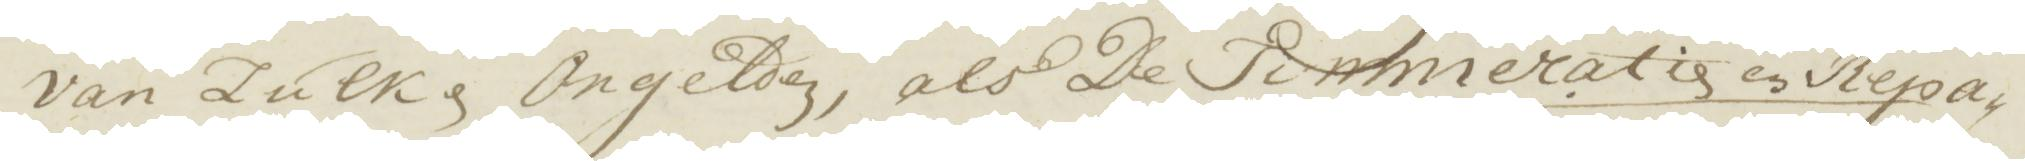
van zulke ongelden, als De Timmeratien en Repa„
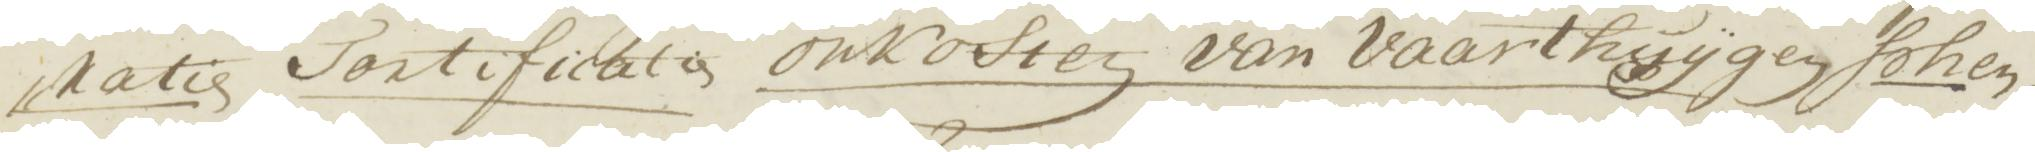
ratien Fortificatie onkosten van Vaarthuijgen Schen
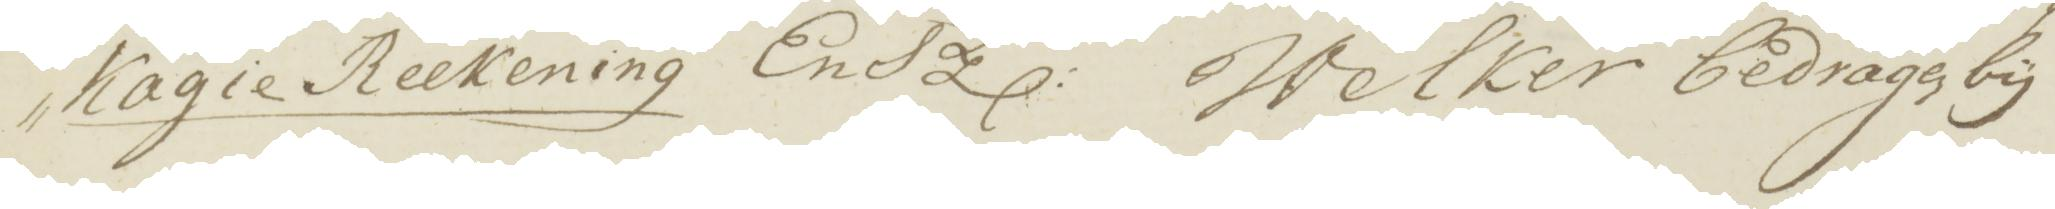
„Kagie Reekening Ensz: welker bedragen bij
